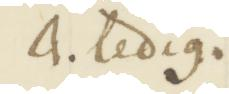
4. ledig.
